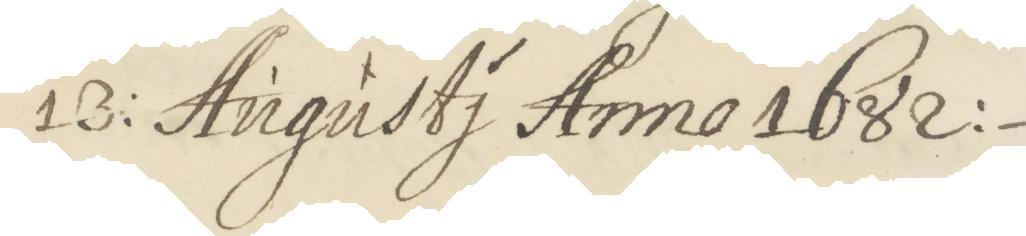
13: Augusti Anno 1682: –
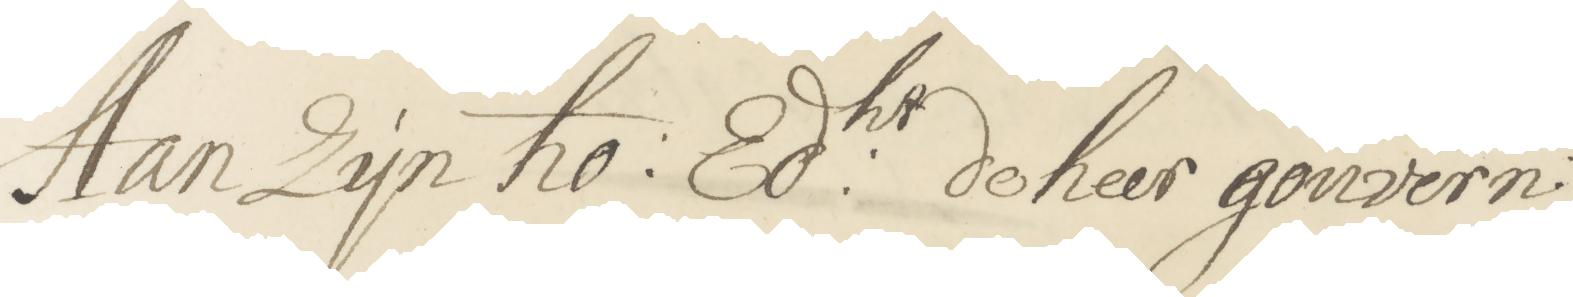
Aan zijn ho: Ed:ht de heer gouvern:
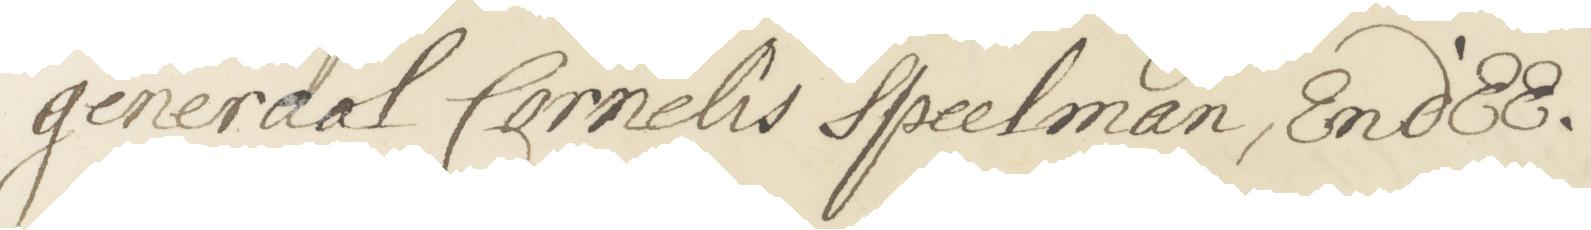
generaal Cornelis Speelman, En d'EE.
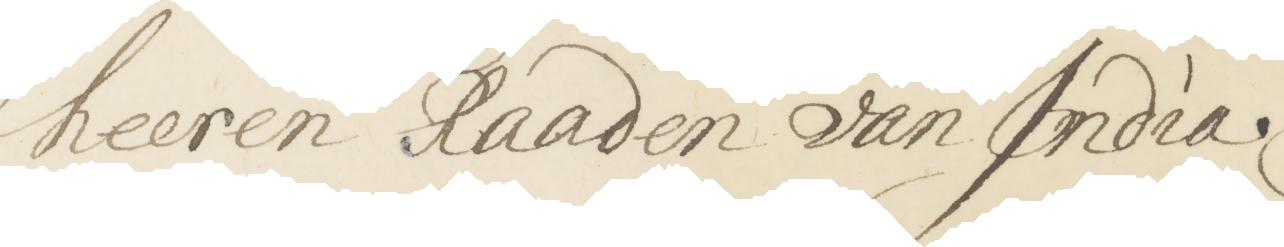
heeren Raaden van India.
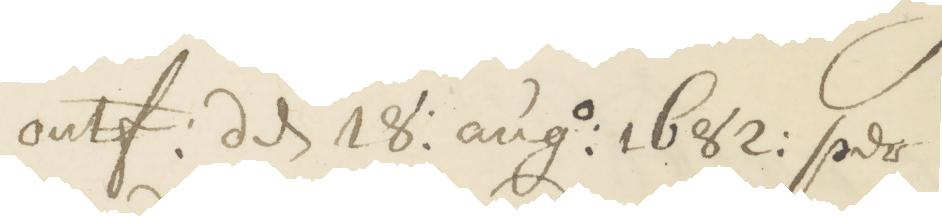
ontf: den 18: aug:o 1682: per
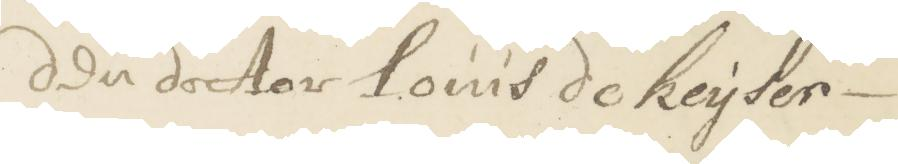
den doctor Louis de keijser –
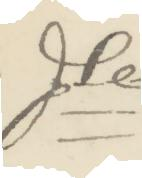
d=le
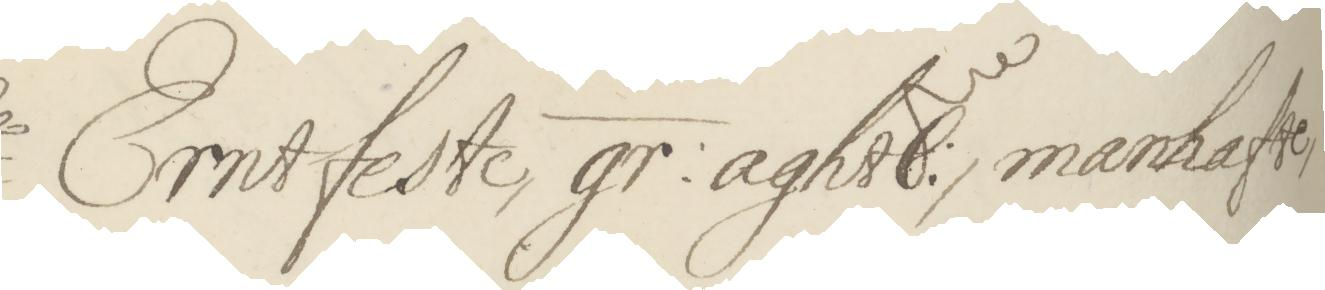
Erntfeste, gr: aghtb:e, manhafte,
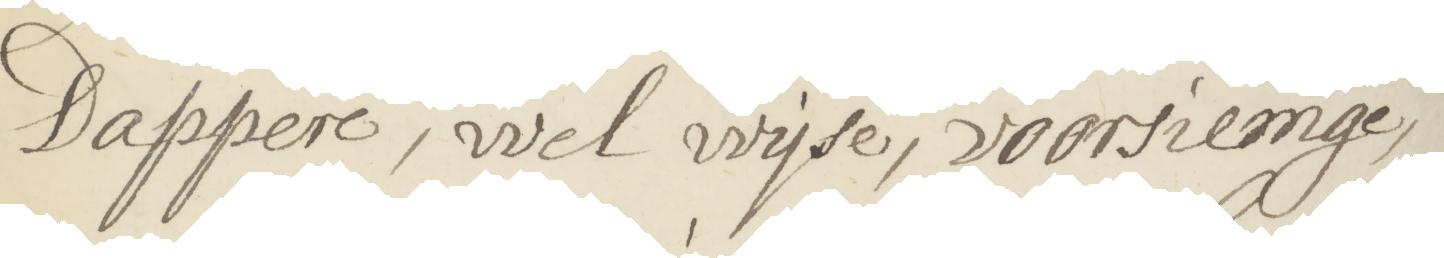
Dappere, wel wijse, voorsienige,
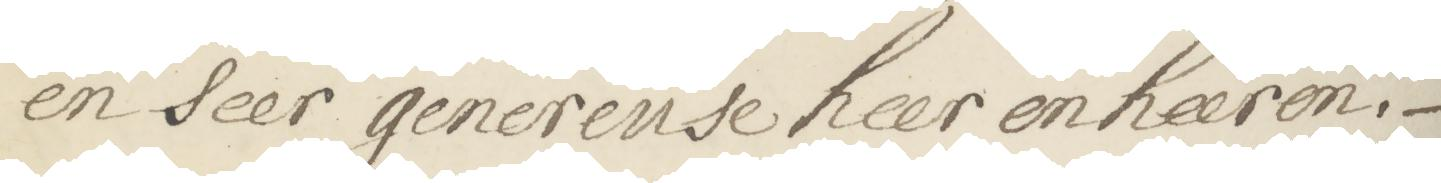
en seer genereuse heer en heeren. –
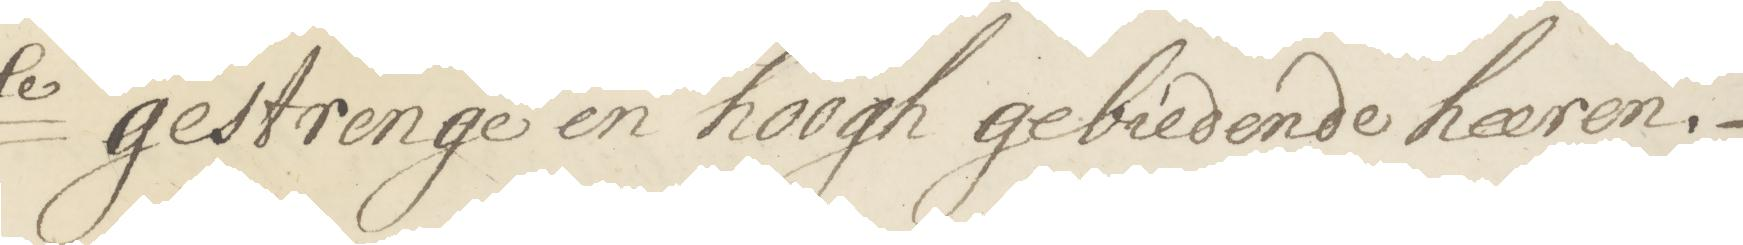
=le gestrenge en hoogh gebiedende heeren. –
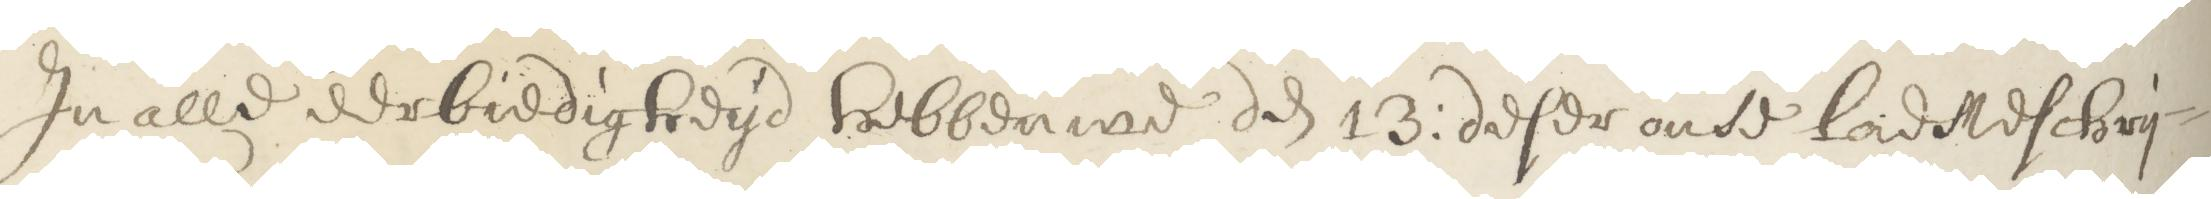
In alle eerbiedigheijd hebben we den 13: deser onse laesteschrij=
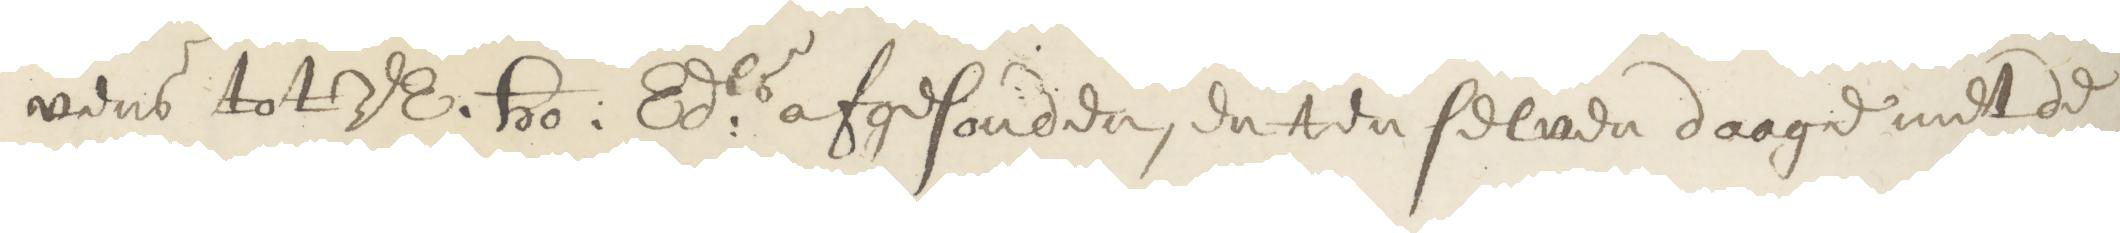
vens tot UE: ho: Ed:ls afgesonden, en ten selven daage met de
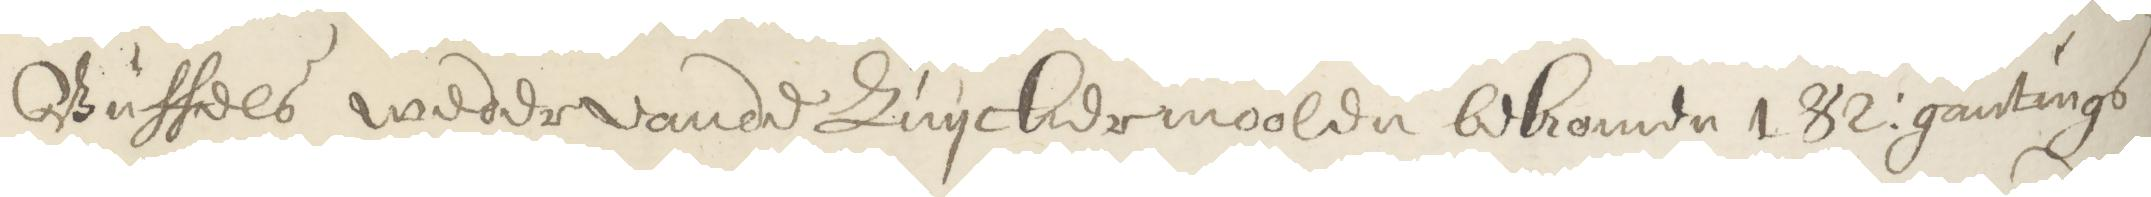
Buffels weder vande zuijckermoolen bekomen 1 & 2: gantings
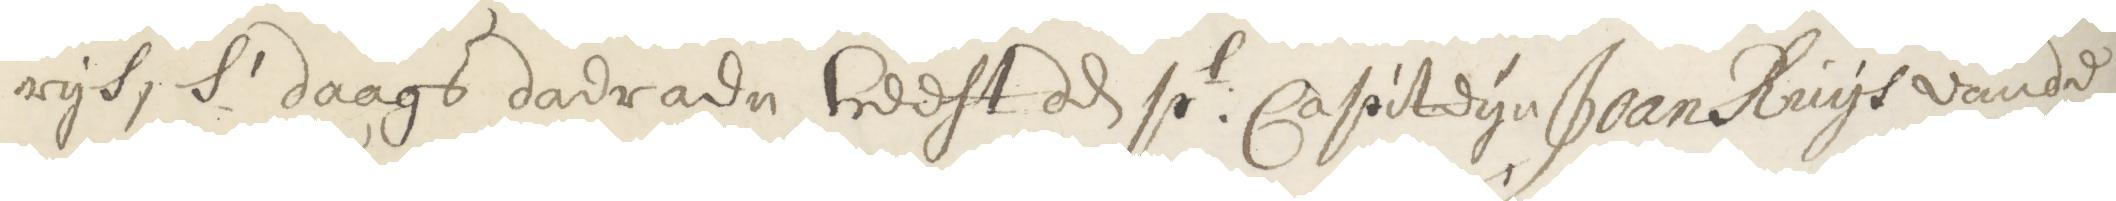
rijs, s' daags daer aen heeft den p:l Capiteijn Joan Huijs van de
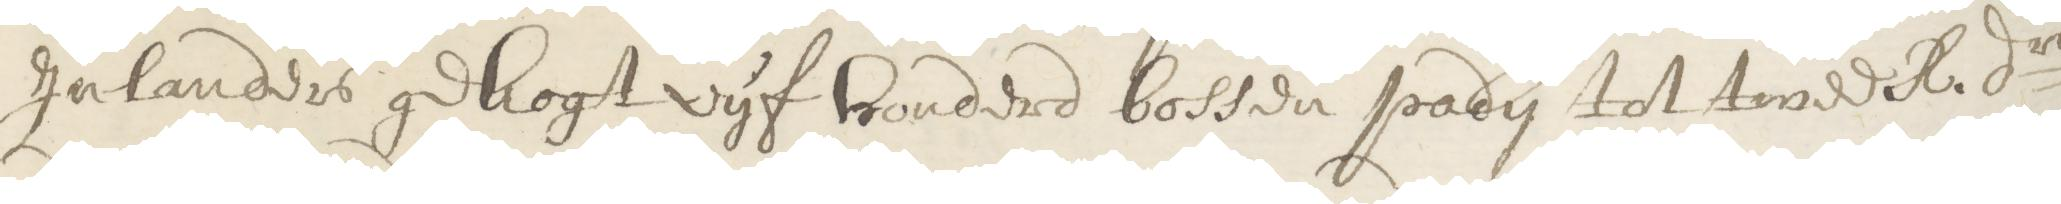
Inlanders gekogt vijf honderd bossen padij tot twee R. d=r
